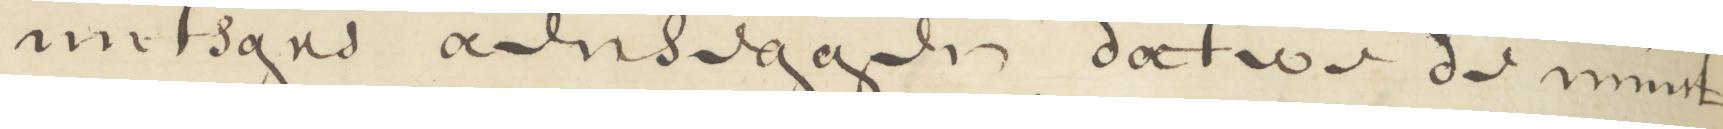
mitsgrs. aenseggen dat we de minst
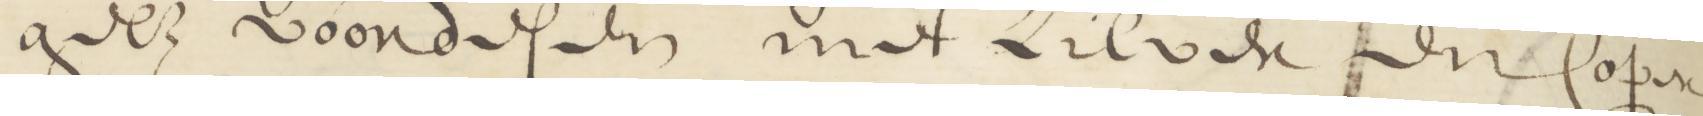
gelijk voordesen met Zilver en Coper
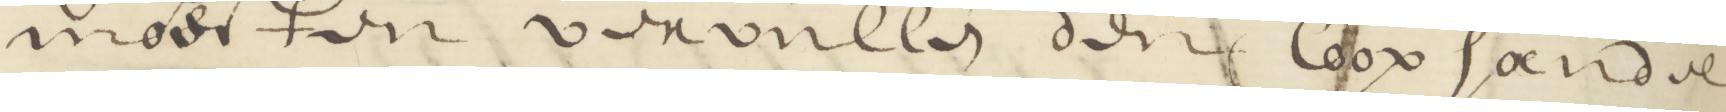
moesten vervullen den Coophandel
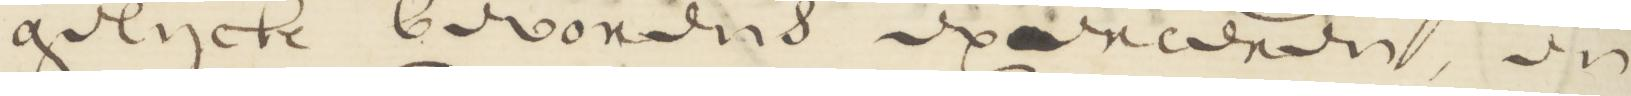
gelijck bevorens exerceren, en
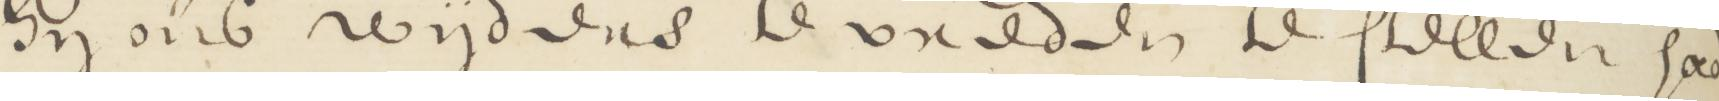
hy ons wijdens te vreden te stellen had
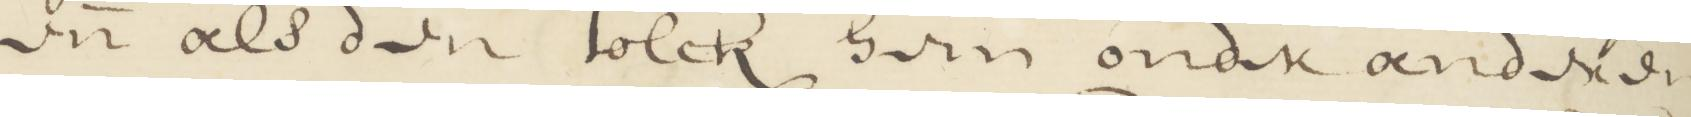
en als den tolck hem onder anderen
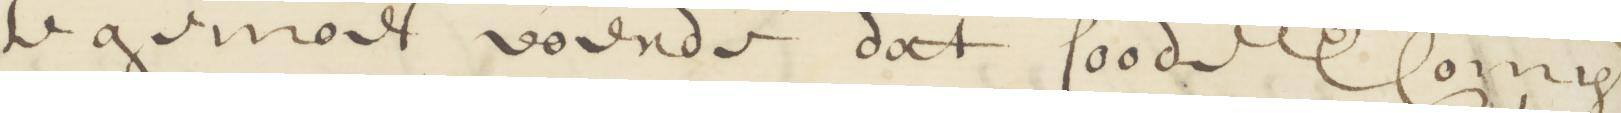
tegemoet voerde doet soode E Comp
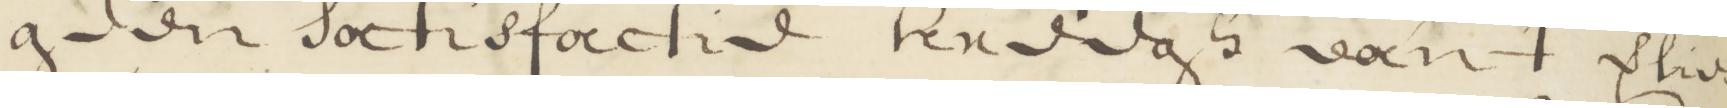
geen satisfactie kreegh van 't verlie
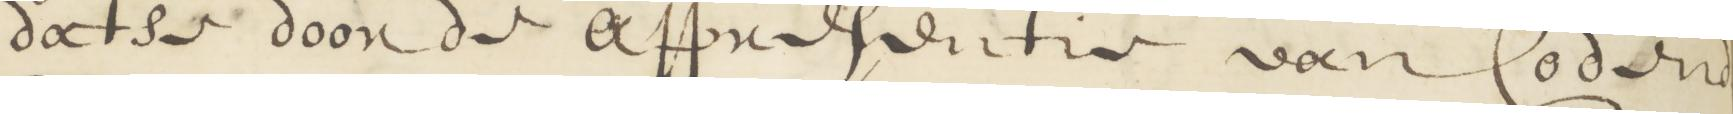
dat se door de apprehentie van Codend
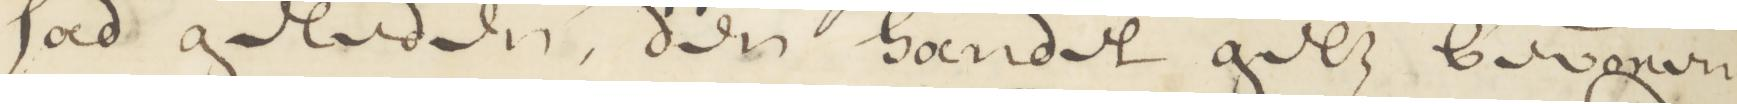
had geleden, den handel gelijk bevoren
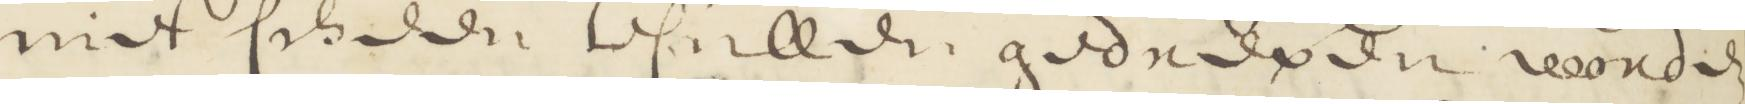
niet scheen te sullen gedreven worde
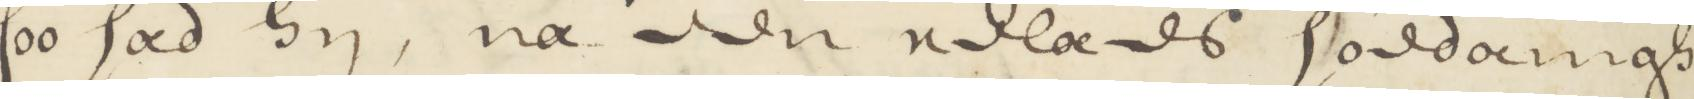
soo had hy, na een relaes hoedanigh
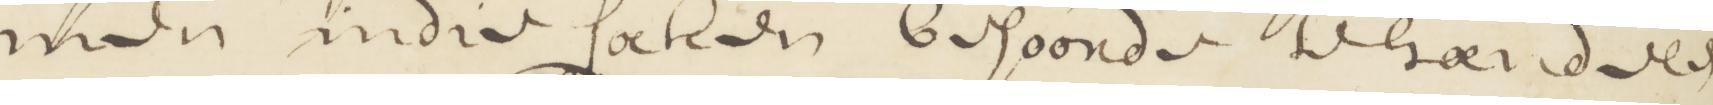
men indie saken behoorde te handelen
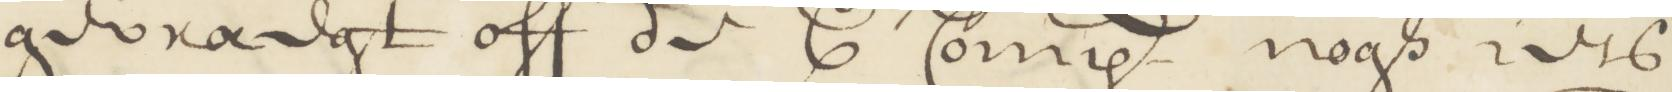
gevraegt off de E Comp. nogh iets
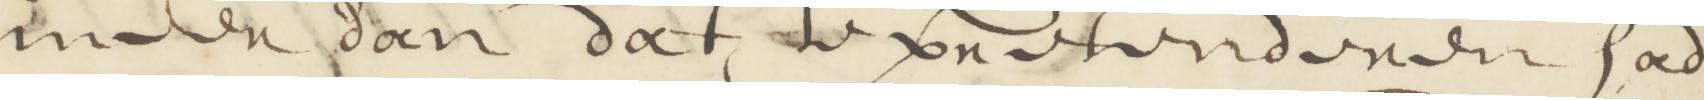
meer dan dat te pretenderen had
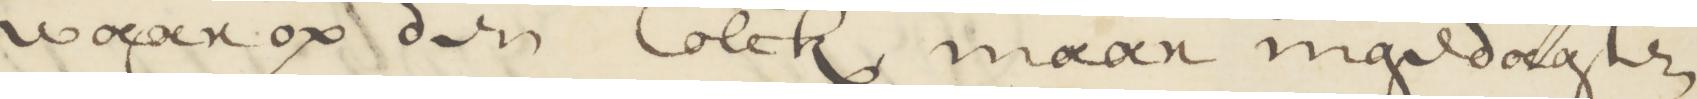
waarop den Tolck, maar ingedagten
